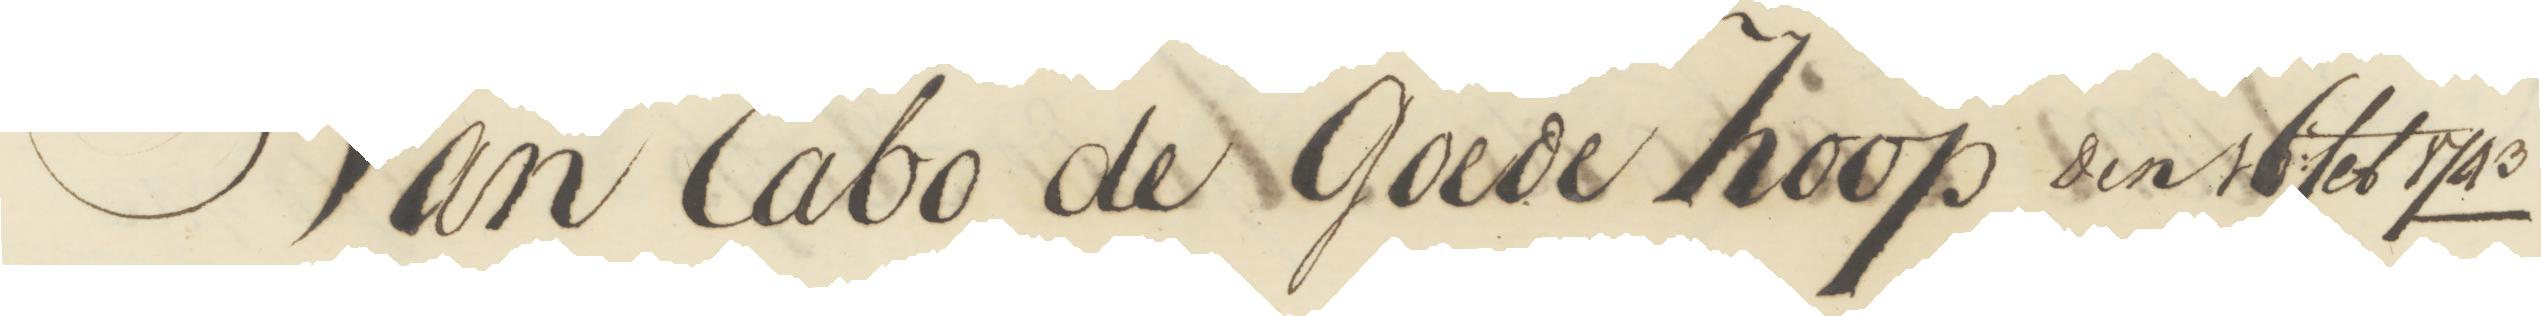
Van Cabo de goede hoop den 16:' feb 1743
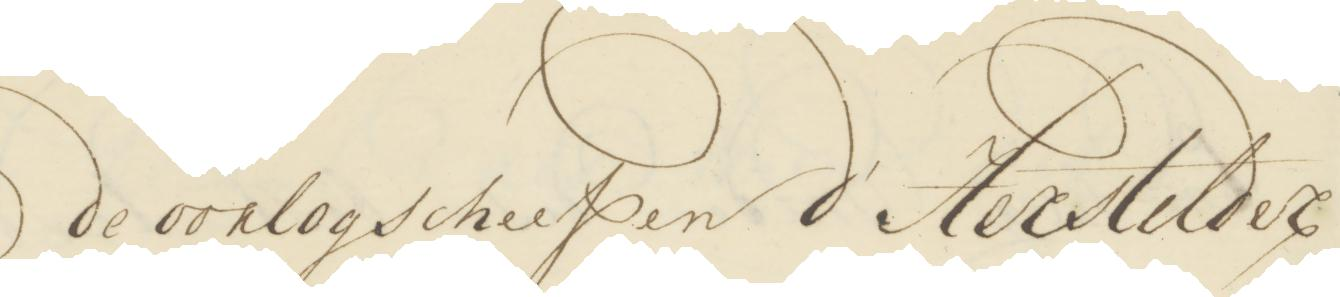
de oorlogscheepen d’ Herstelder
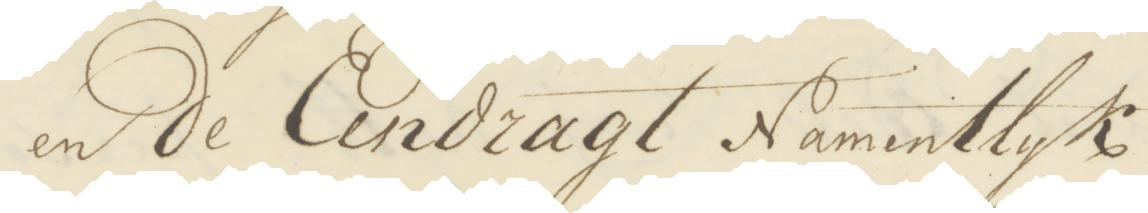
en de Eendragt Namentlyk
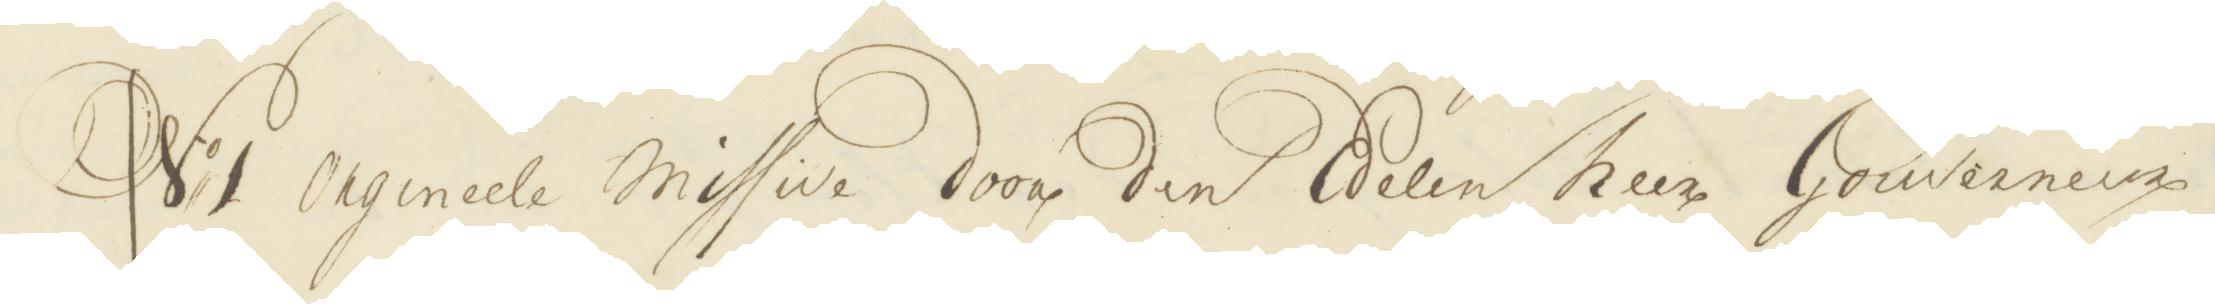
N„o 1 origineele missive door den Edelen heer Gouverneur
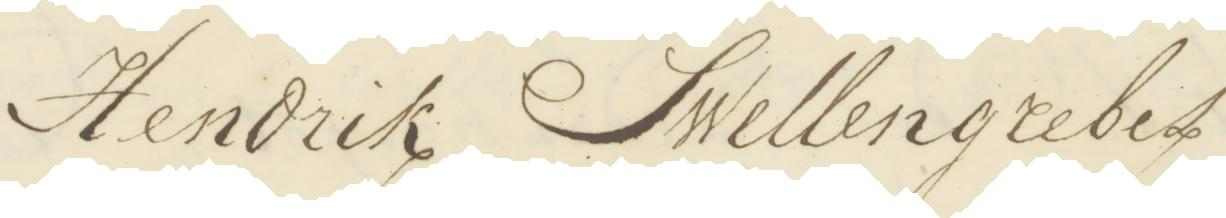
Hendrik Swellengrebel
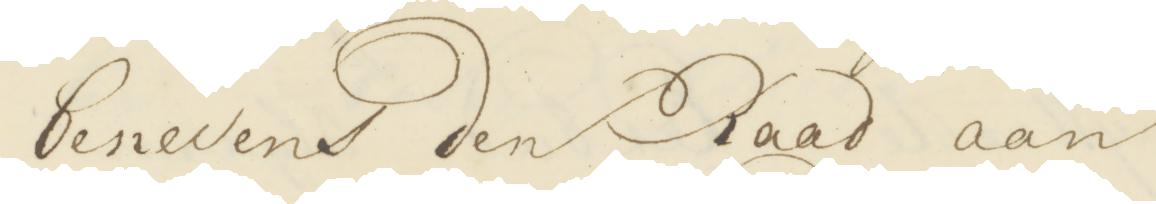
benevens den Raad aan
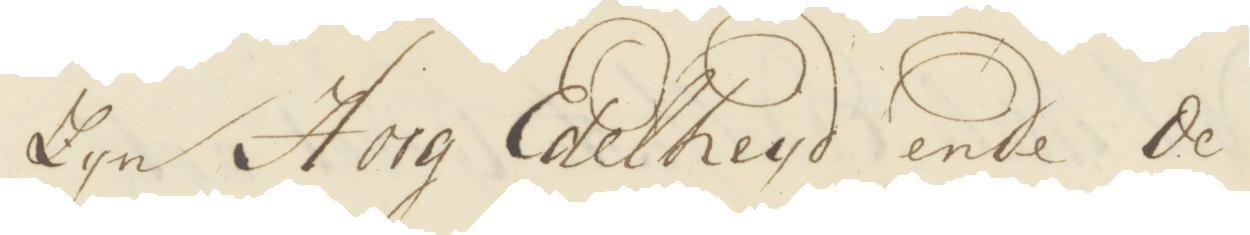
zyn Hoog Edelheyd ende de
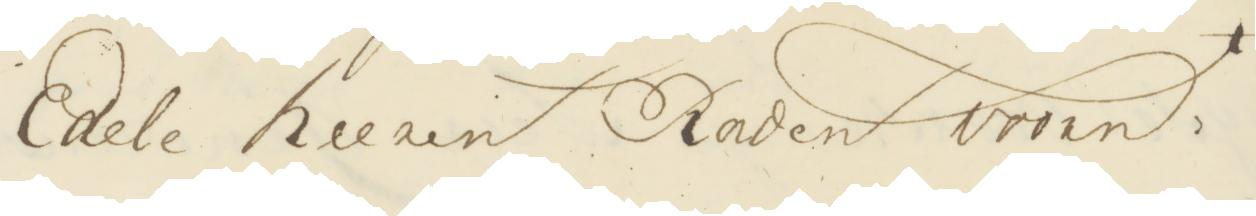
Edele heeren Raden voorn:t
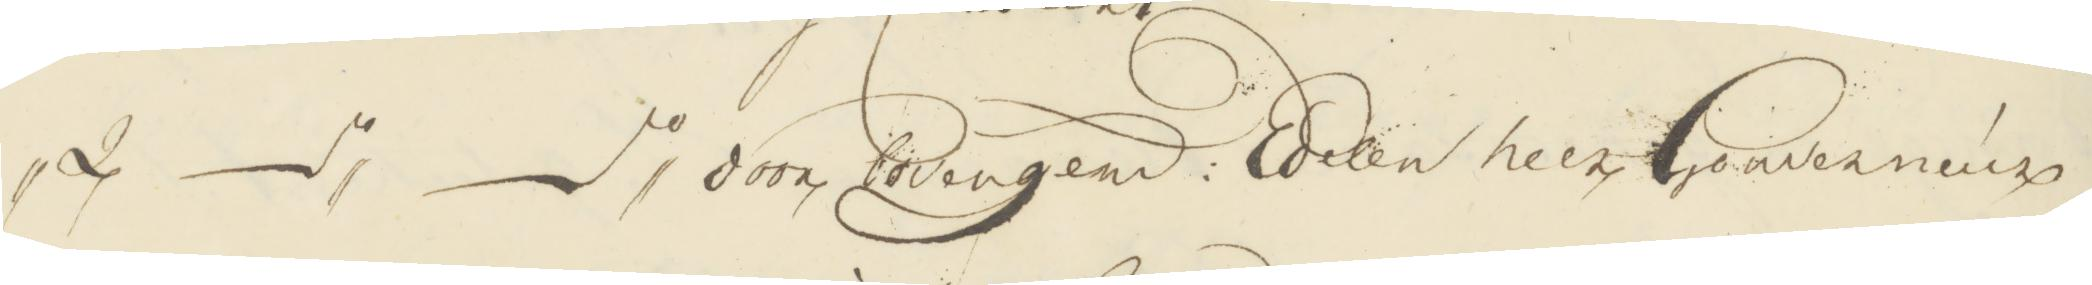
„ 2 _„o _„o door bovengem: Edelen heer Gouverneur
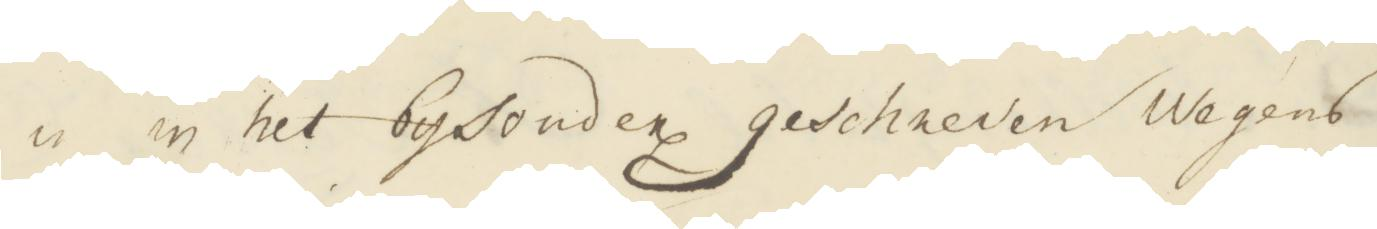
is in het bysonder geschreven wegens
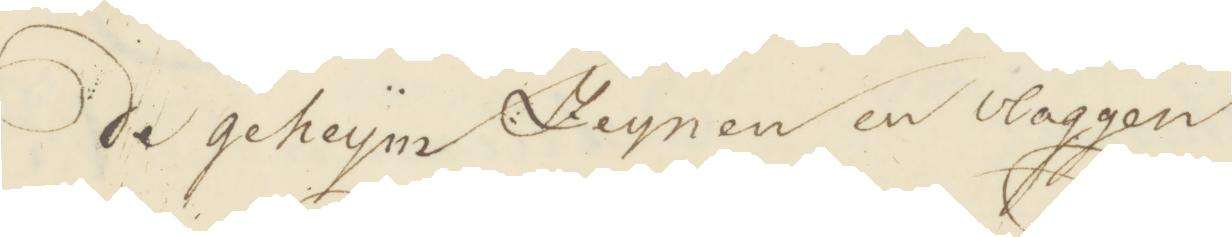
de geheijm zeynen en vlaggen
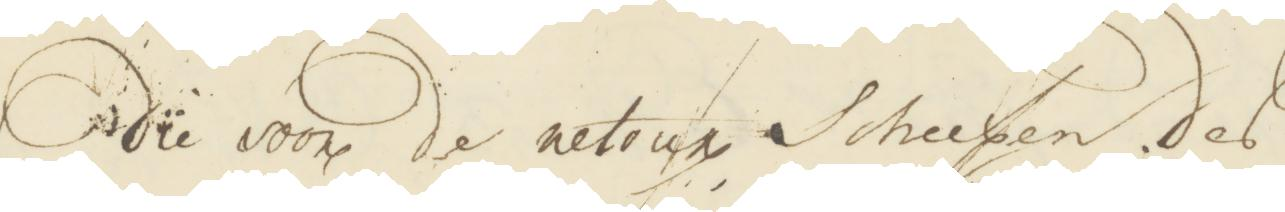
die voor de retour scheepen des
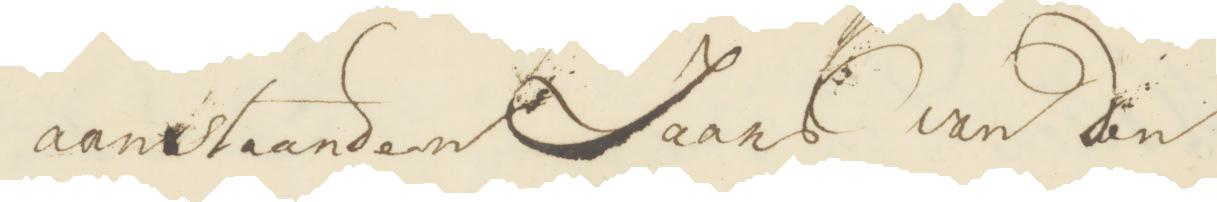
aanstaanden Iaars van den
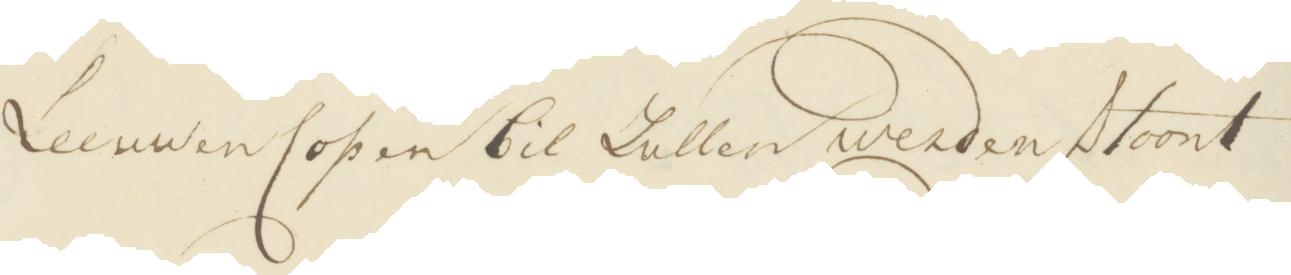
Leeuwen Cop en bil zullen werden vertoont
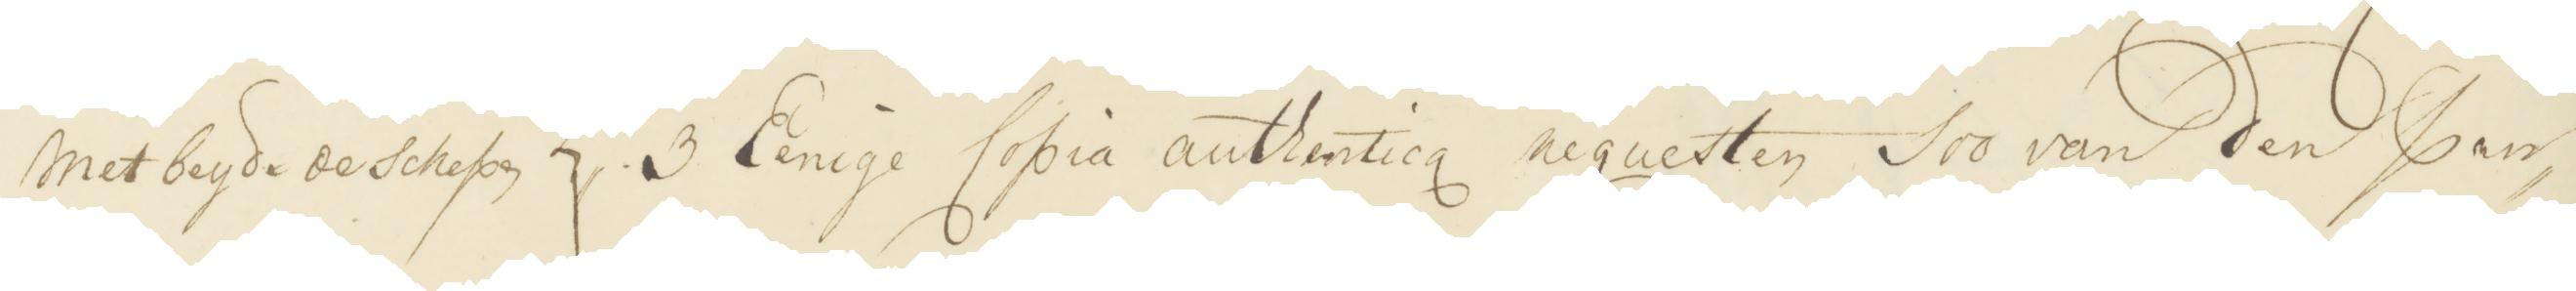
met beyde de schepen „ . 3 Eenige Copia anthenticq requesten soo van den Pan„
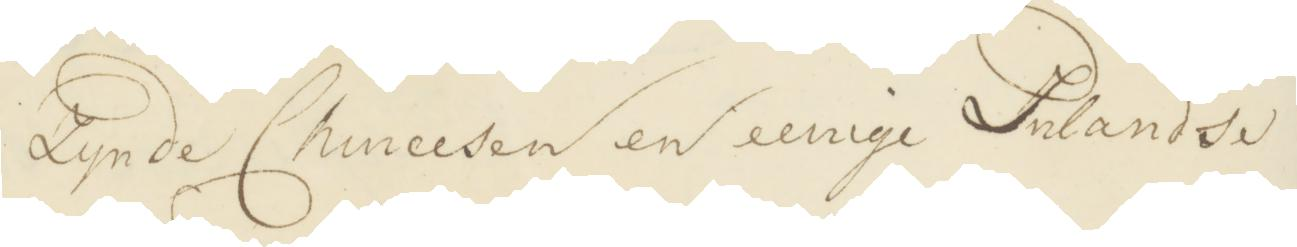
zynde Chineesen en eenige Inlandse
